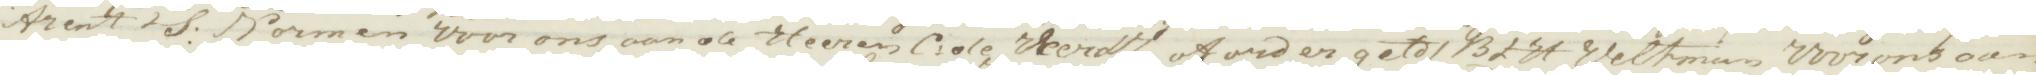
Arent S: Normen voor ons aan de Heeren C: de Veerdt Jr of order getd / BLH Veltman Voor ons aan
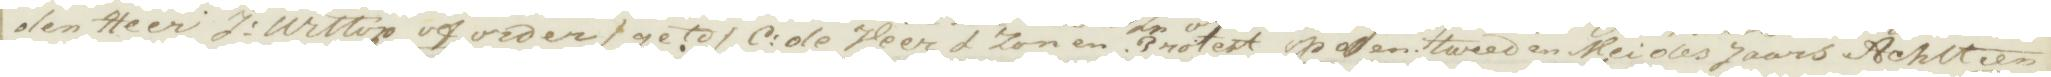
den Heer J: Urttop of order / getd / C: de Veer & Zonen Protest op den tweeden Mei des Jaars Achttien
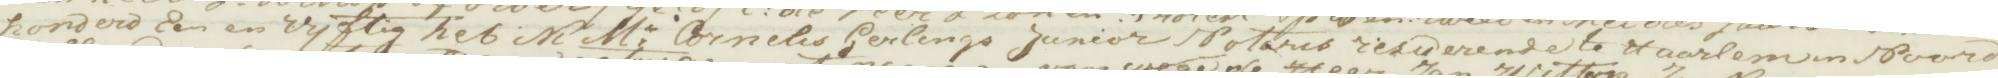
honderd Een en vijftig heb ik M„r Cornelis Gerlings Junior Notaris residerende te Haarlem in Noord
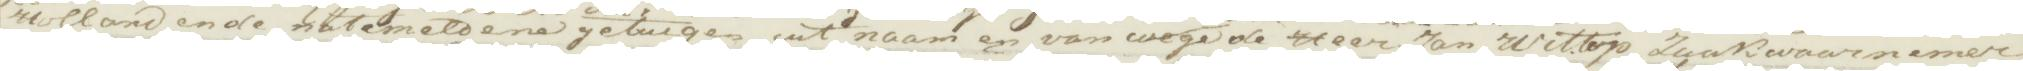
Holland en de natemeldene getuigen uit naam en van wege de Heer Jan Wittop Zaakwaarnemer
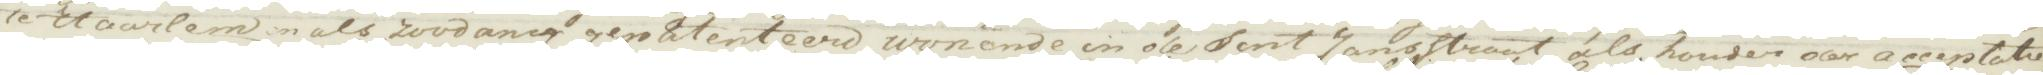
te Haarlem en als zoodanig gepatenteerd wonende in de Sint Jansstraat als houder der acceptatie
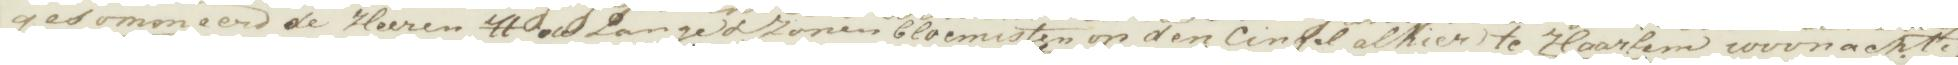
gesommeerd de Heeren H de Lange & Zonen bloemisten op den Cingel alhier te Haarlem woonachtig
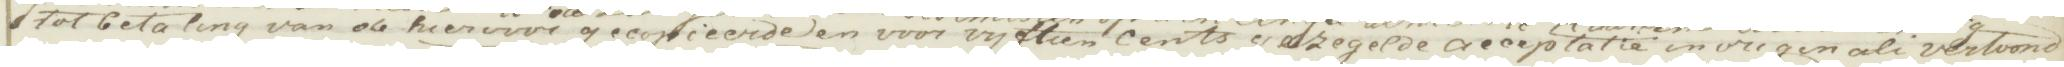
tot betaling van de hiervoor gecopieerde en voor vyftien Cents gezegelde acceptatie in origenali vertoond
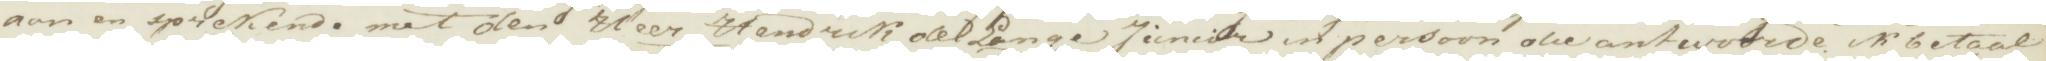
aan en sprekende met den Heer Hendrik de Lange Junior in persoon die antwoorde, ik betaal
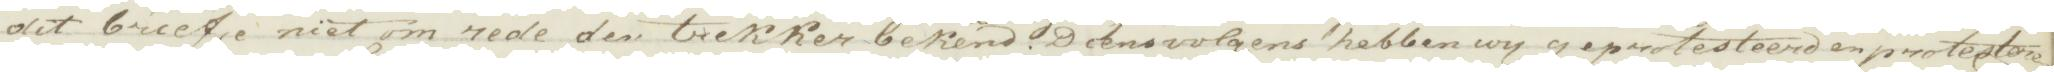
dit briefje niet om rede den trekker bekend Diens volgens hebben wy geprotesteerd en protesteren
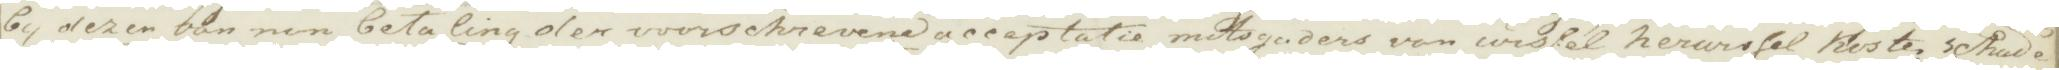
by dezen van non betaling den voorschrevene acceptatie mitsgaders van wissel herwissel kosten schade
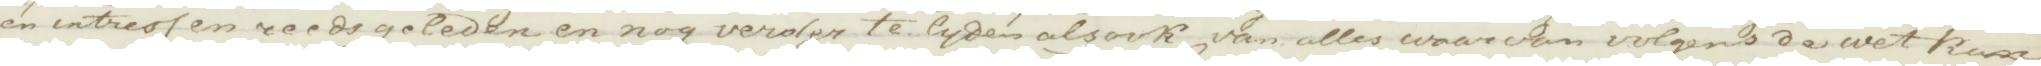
en intressen reeds geleden en nog verder te lyden als ook van alles waar van volgens de wet kan
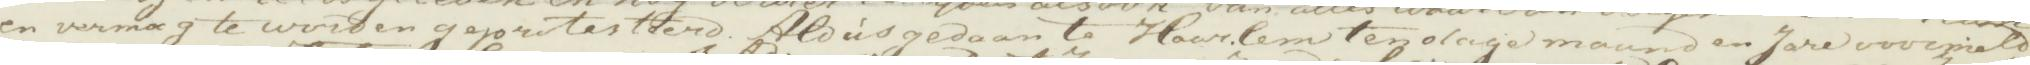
en vermag te worden geprotesteerd. Aldus gedaan te Haarlem ten dage maand en Jare voormeld
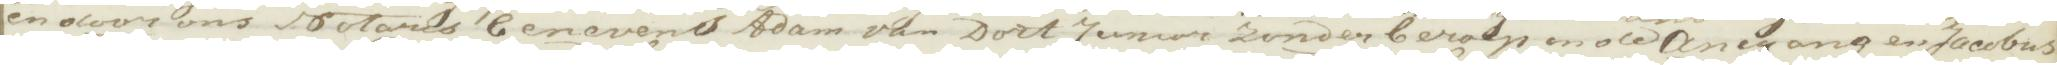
en door ons Notaris benevens Adam van Dort Junior zonder beroep in de Anegang en Jacobus
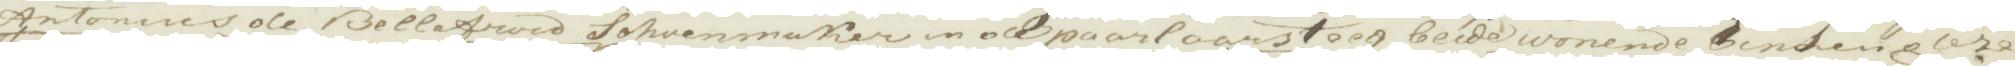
Antonius de Bellefroid schoenmaker in de paarlaarsteeg beide wonende binnen deze
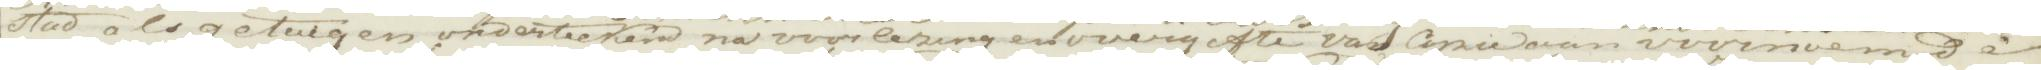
stad als getuigen onderteekend na voor lezing en overgifte van Copie aan voornoemde
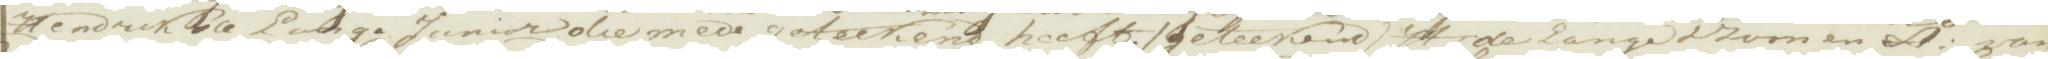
Hendrik de Lange Junior die mede geteekend heeft. / geteekend / H de Lange & Zoon en A: van
